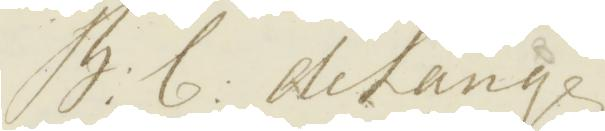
B: C: de Lange
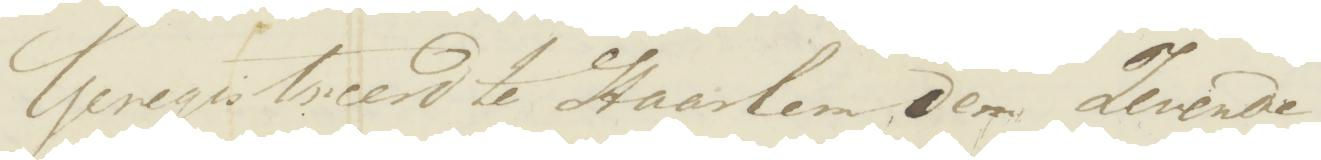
Geregistreerd te Haarlem, den Zevende
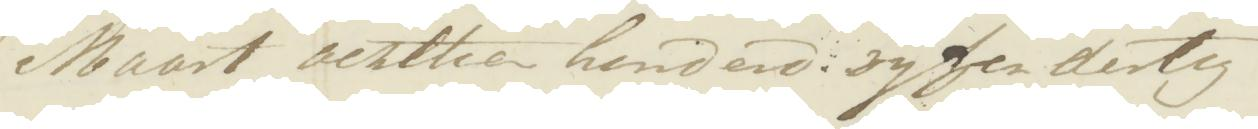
Maart achttien honderd: vyf en dertig
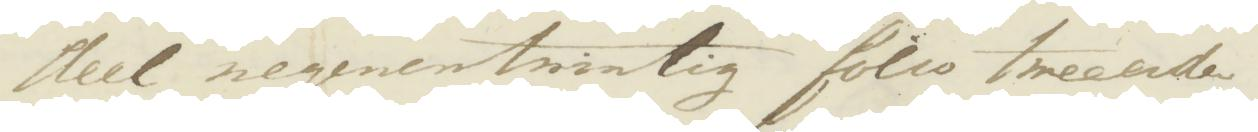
deel negenentwintig folio tweeender
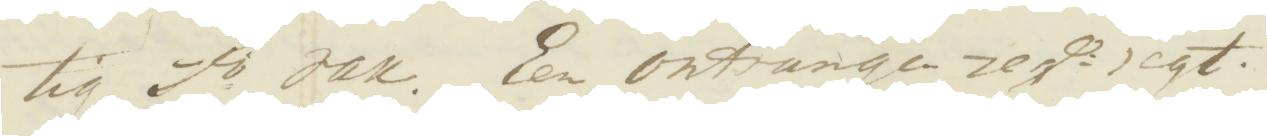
tig V=o vak Een ontvangen zeg=l regt.
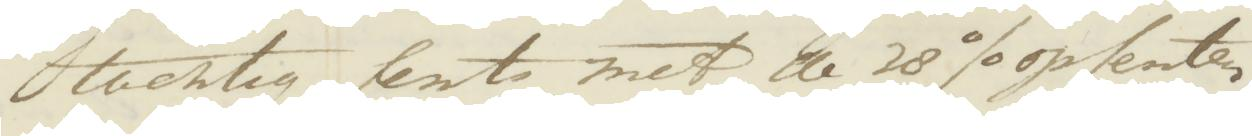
tachtig Cents met de 38 % opcenten
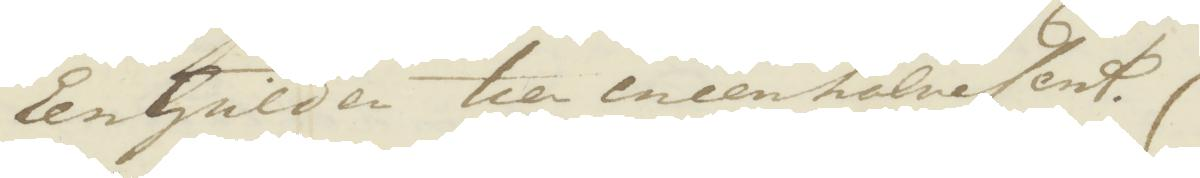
Een Gulden tien en een halve Cent.
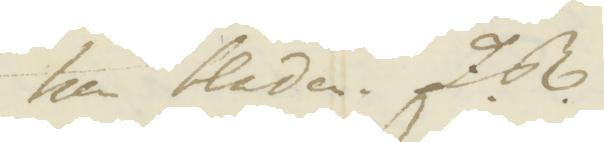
tien bladen. Z.R.
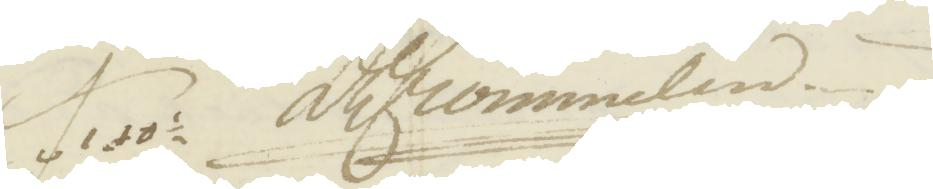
ƒ 1.10½ DF Crommelin.
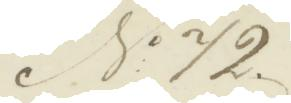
N:o 72.
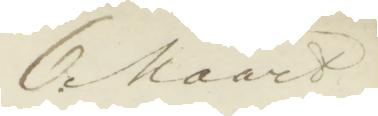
6. Maart
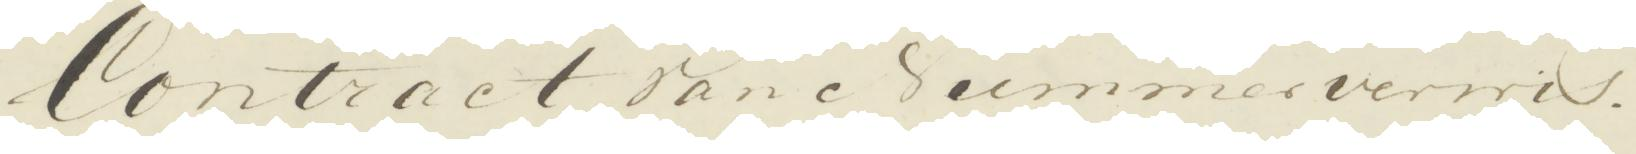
Contract van Nummerverwis.
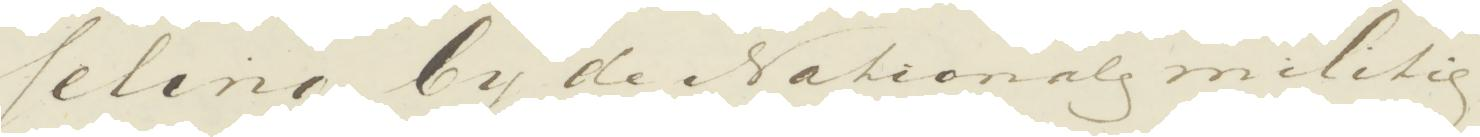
seling by de Nationale militie
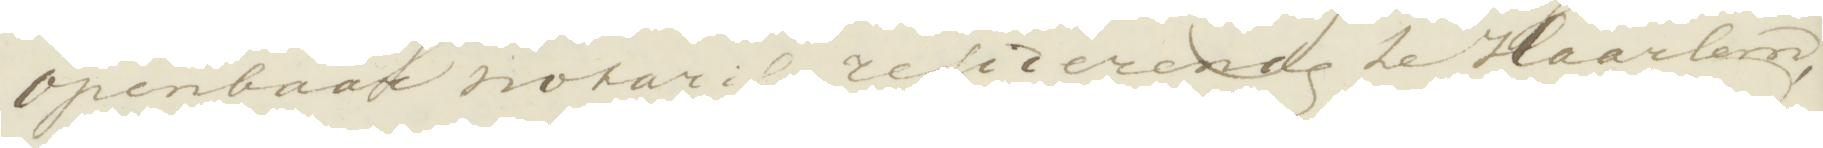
openbaar notaris, residerende te Haarlem,
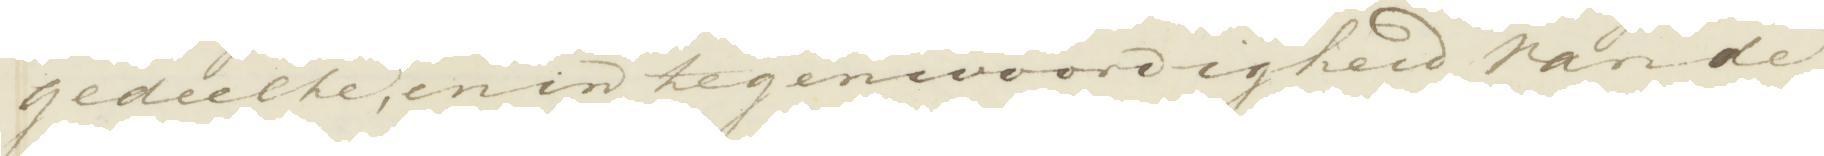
gedeelte, en in tegenwoordigheid van de
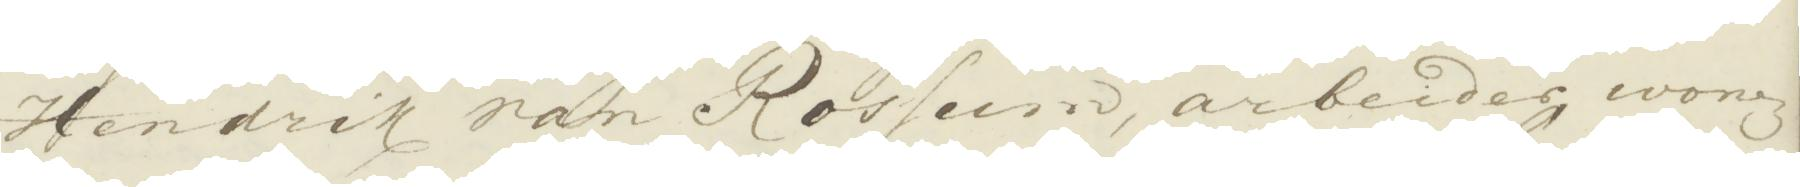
Hendrik van Rossum, arbeider, wonen
